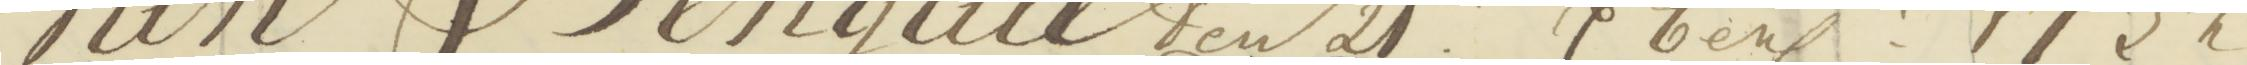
Van Bengale den 21:' 7ber : 1732
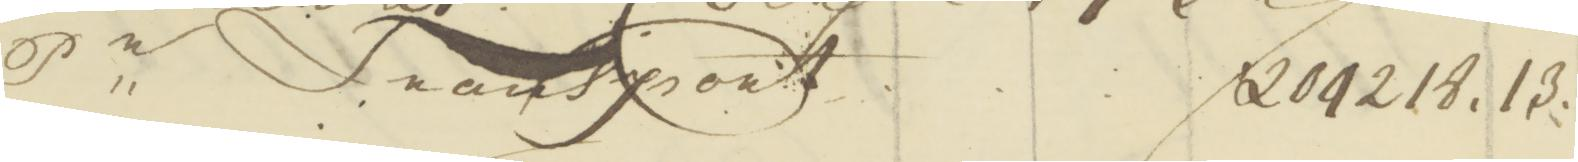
P„r Transport . . : ƒ 204218.13.
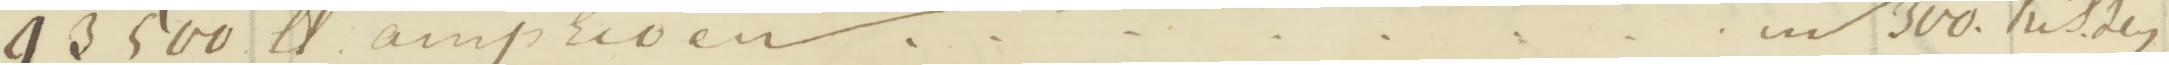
43500 lb. amphioen.. . . . . . . in 300. Kisten
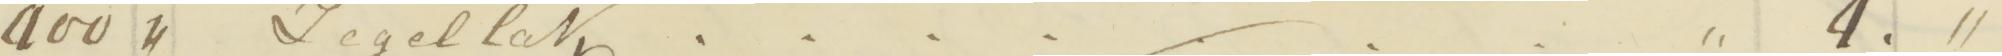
400 „ Zegellak 4. . . . . . . . „ 4. „
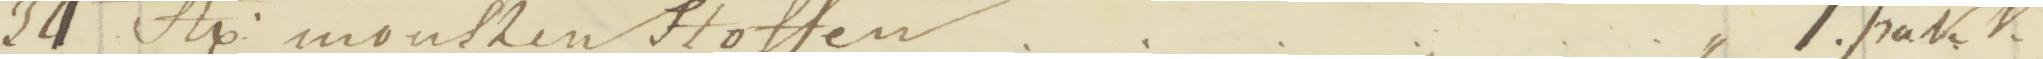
34 stx: mouslen stoffen . . . . . „ 1. pakk
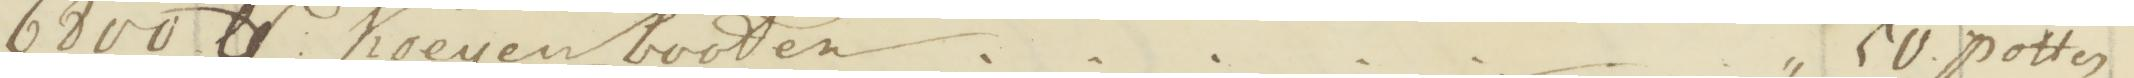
6800 lb. Koeijen booter . . . . . . „ 50. potten
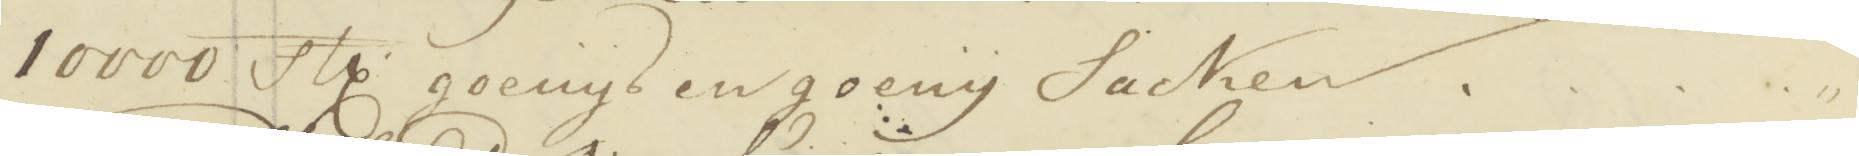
10000 stx: goenijs en goenij Sacken . . . . „ . . . .
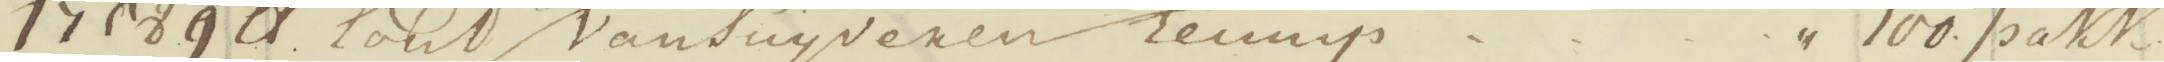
17589 lb. houd van Suijveren hennip . . . . „ 100 Pakk:
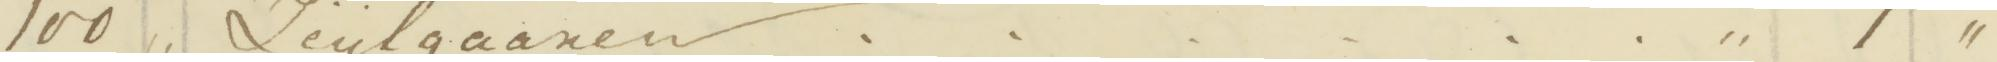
100 „ Zeijlgaaren . . . . . .„ 7 „
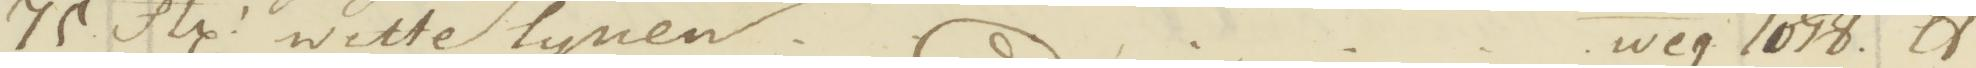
75. stx: witte lynen . . . . . .weg 1078. lb
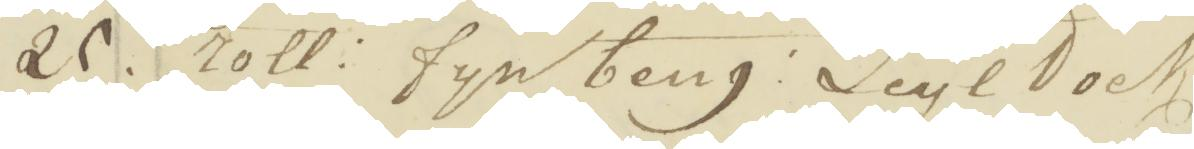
25. roll: fyn beng: Zeijldoek
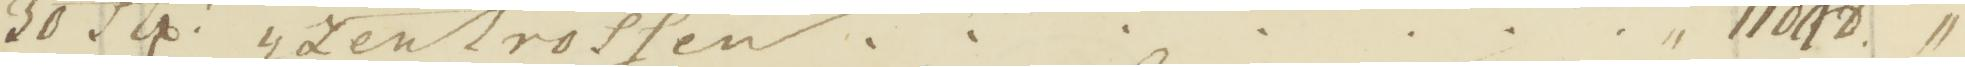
30 stx: ijzer trossen. . . . . . . „ 11048. „
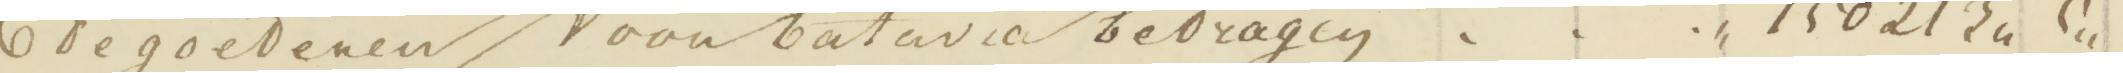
de goederen Voor batavia bedragen . . . „ 150213 „ 5 „
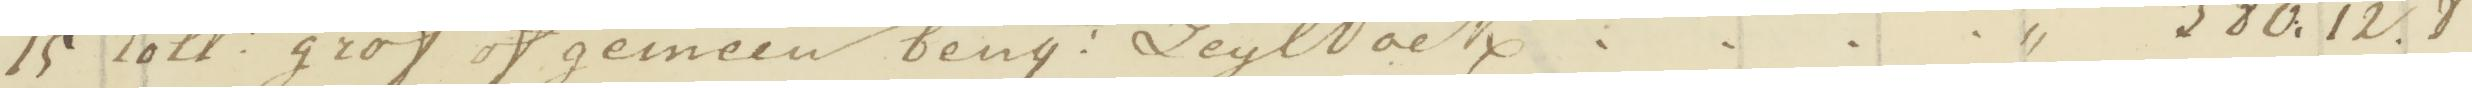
15 Roll grof of gemeen beng: Zeijldoek . . . . „ 380. 12
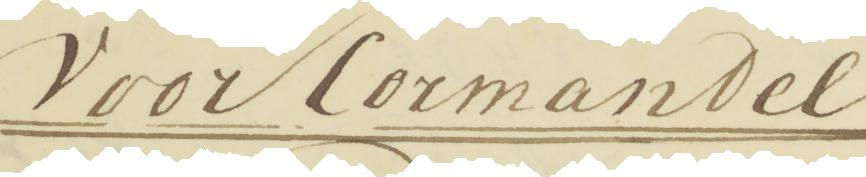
voor Cormandel
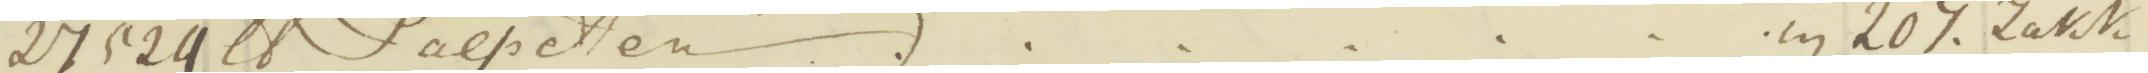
27524 lb Salpeter . . . . . . . in 207. zakk:
